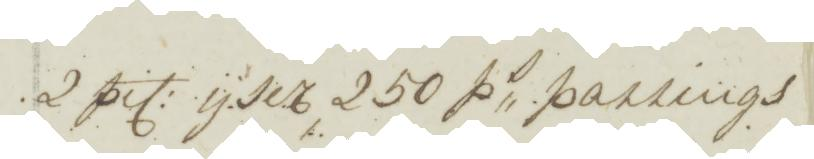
2 pic: ijser, 250 p„s parrings
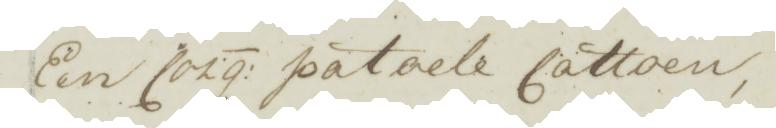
Een Corg: patoele Cattoen,
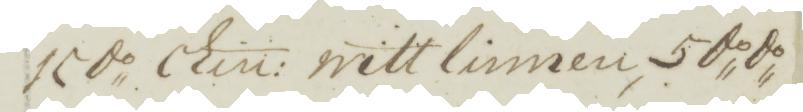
15 d„o chin: witt linnen, 5 d„o d„o
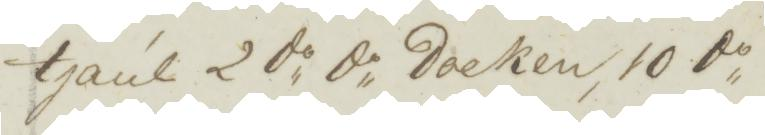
tjaul 2 d„o d„o doeken, 10 d„o
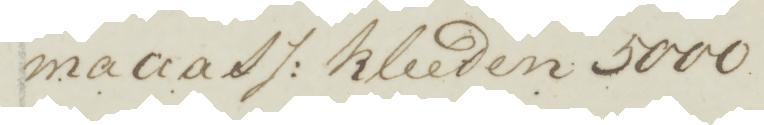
maccass: kleeden 5000
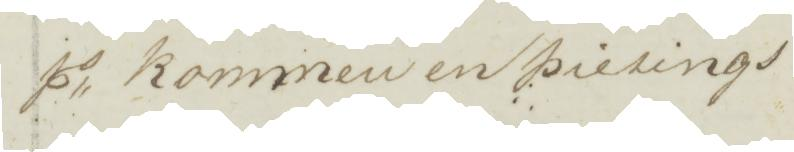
p„s kommen en pierings
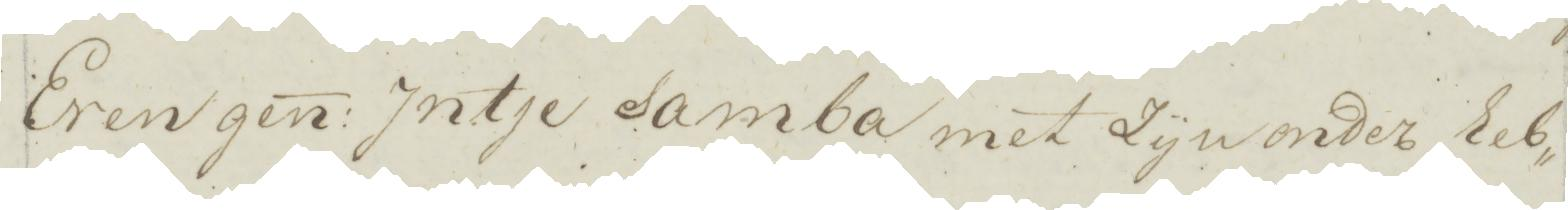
Even gen: Jntje samba met zijn onder heb
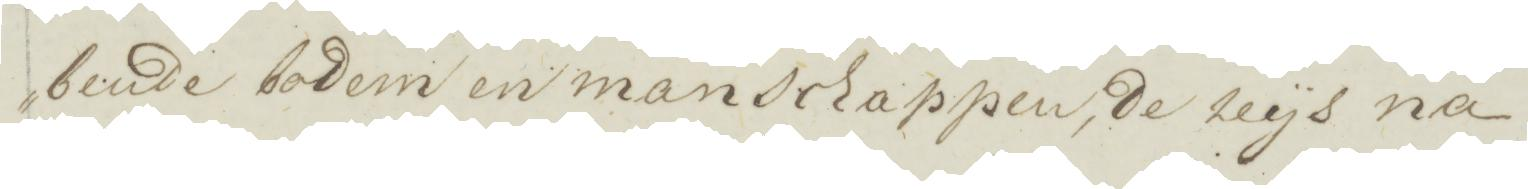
„bende bodem en manschappen, de reijs na
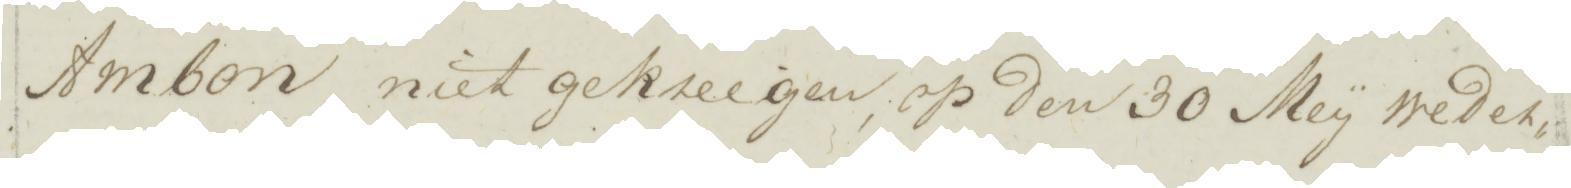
Ambon niet gekreegen, op den 30 Meij weder„
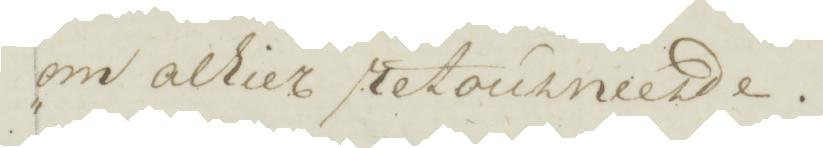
„om alhier retourneerde
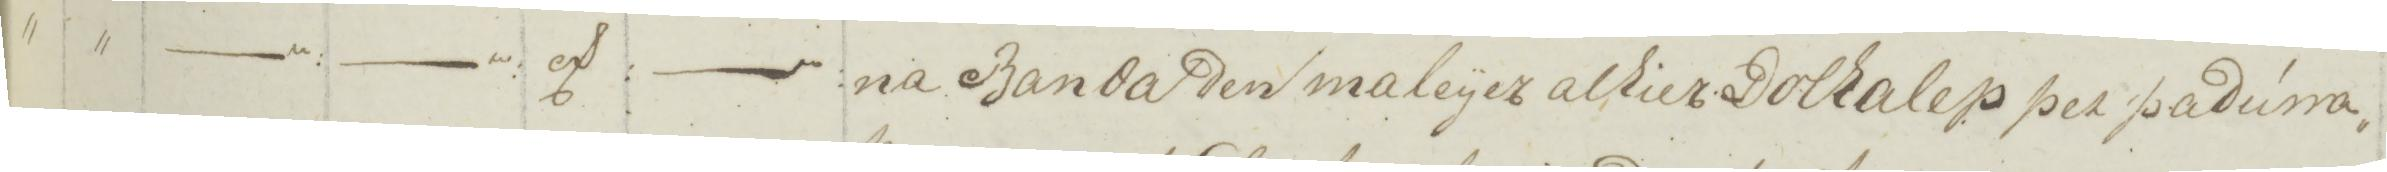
" " _o: _o: over: _o: na Banda den maleijer alhier Dolhalep per paduwa„
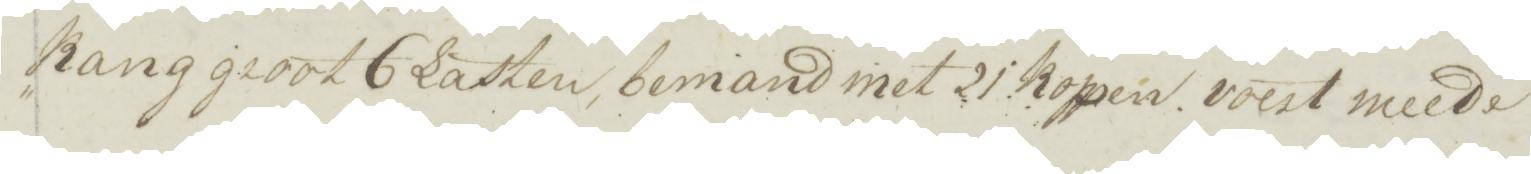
„kang groot 6 lasten, bemand met 21: koppen. voert meede
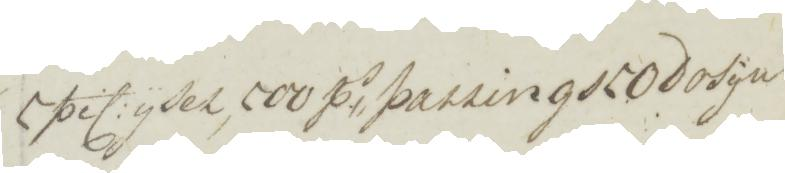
5 pic: ijser, 500 p„s parrings 50 dosijn
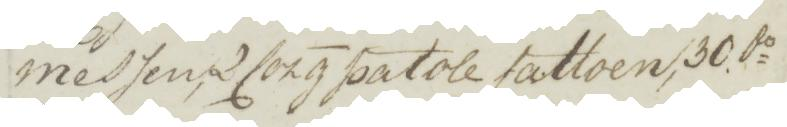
messen, 2 Corg patole Cattoen, 30 d=o
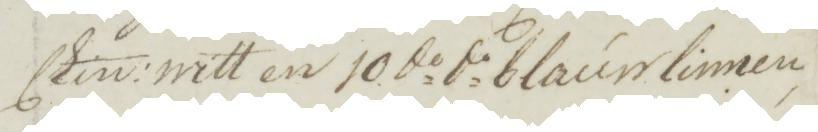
Chin: witt en 10 d=o d=o blauw linnen,
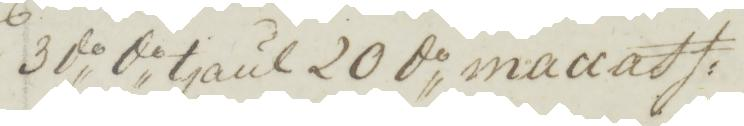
3 d„o d„o tjaul 20 d„o maccass:
